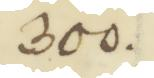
300.
